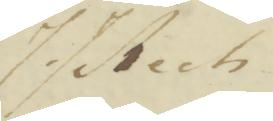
J. J Bech
